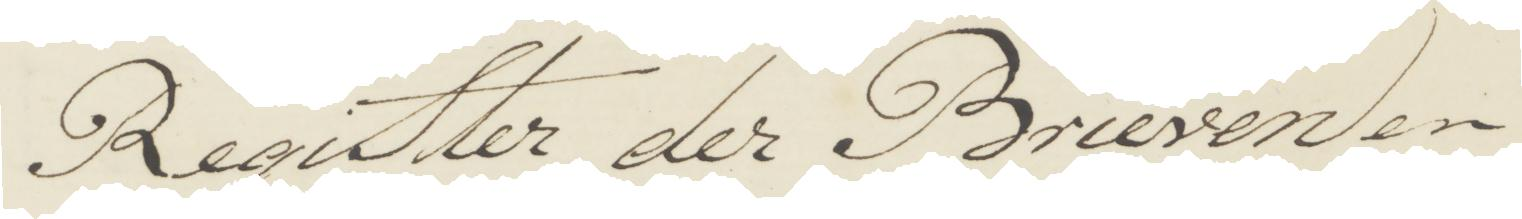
Register der Brieven en
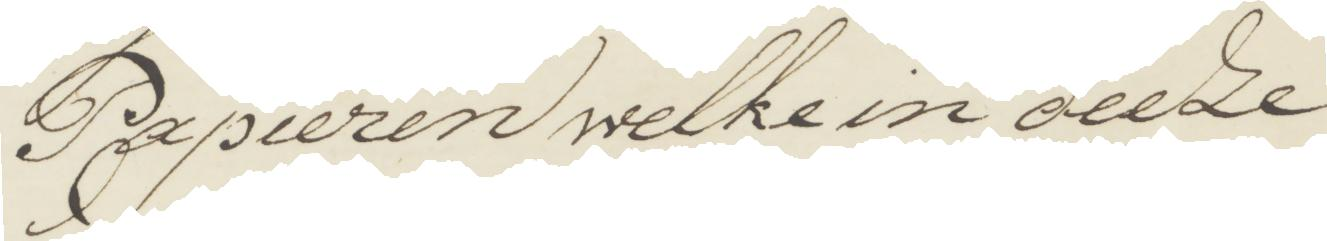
Papieren welke in deeze
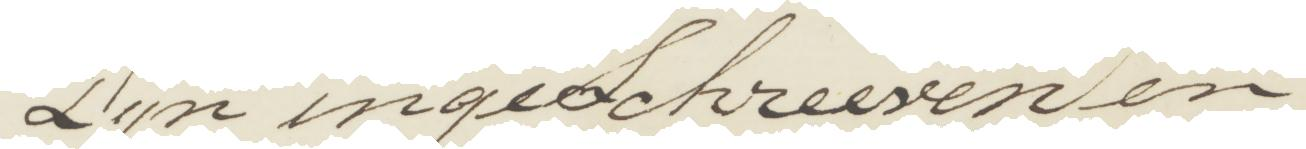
zijn ingeschreeven en
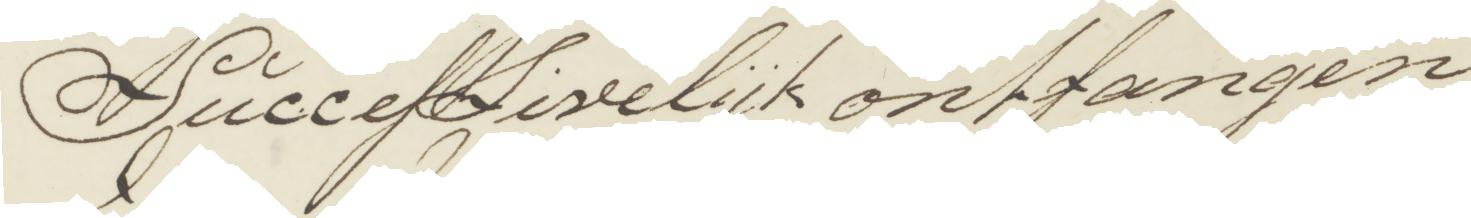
Successivelijk ontfangen
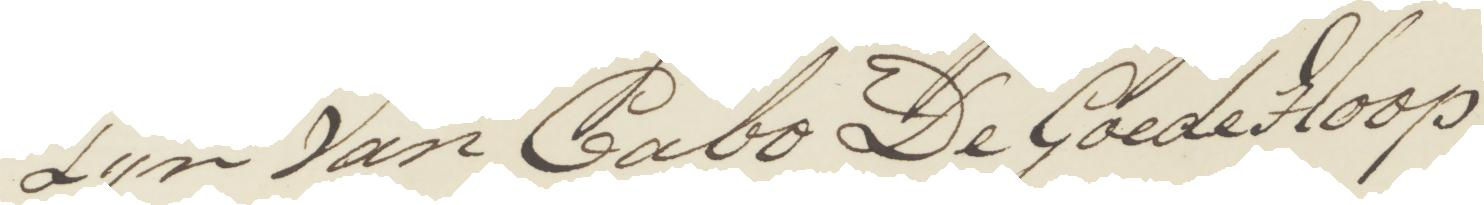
zijn Van Cabo De Goede Hoop,
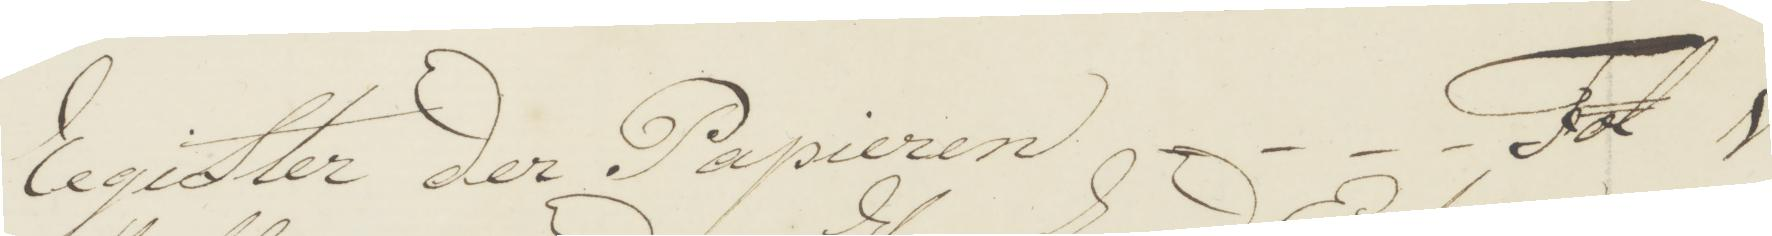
register der Papieren — — — — Fol 1
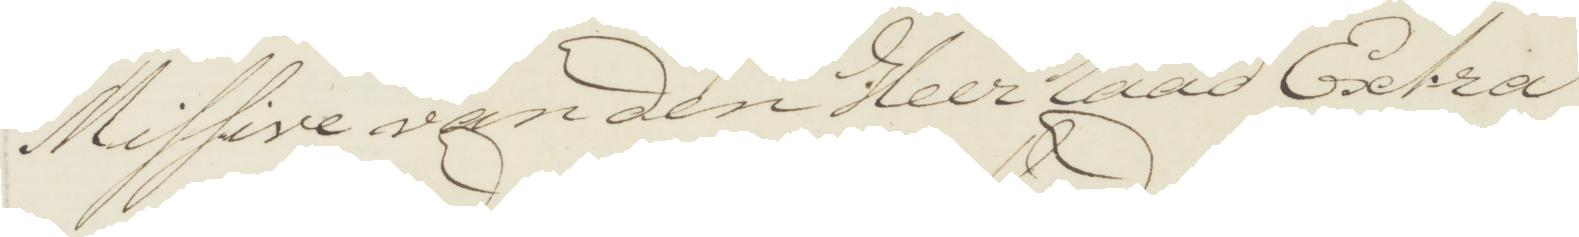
Missive van den Heer raad Extra
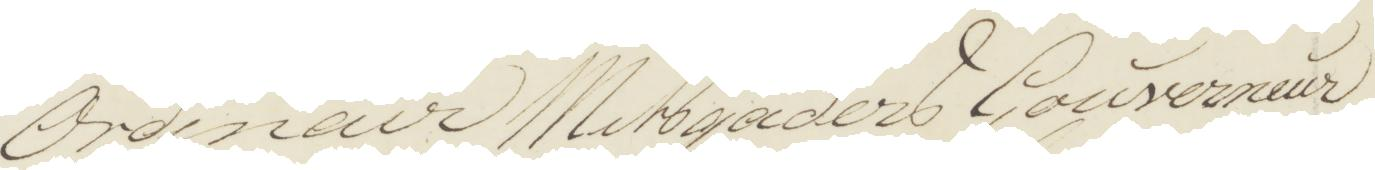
Ordinair Mitsgaders Gouverneur
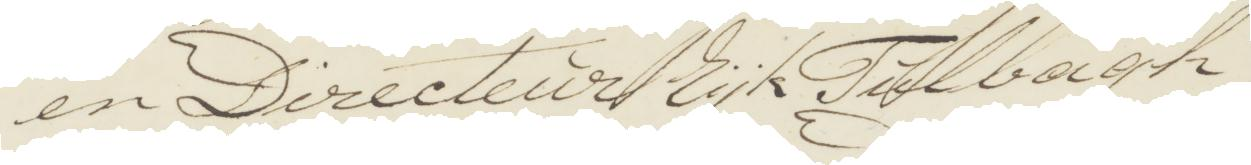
en Directeur rijk Tulbagh
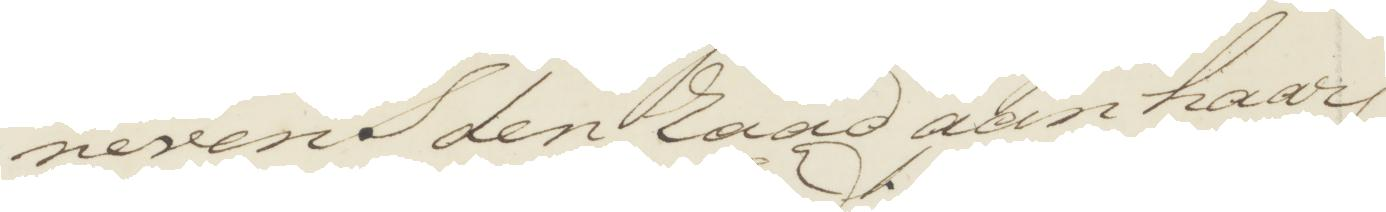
nevens den raad aan haar
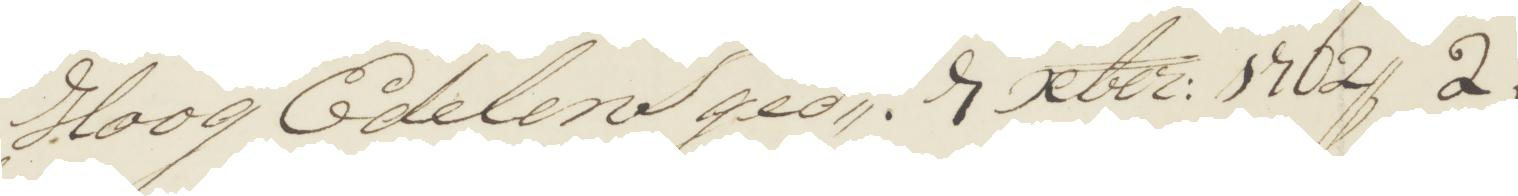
Hoog Edelens ged„t. 7 xber: 1762 „ 2,
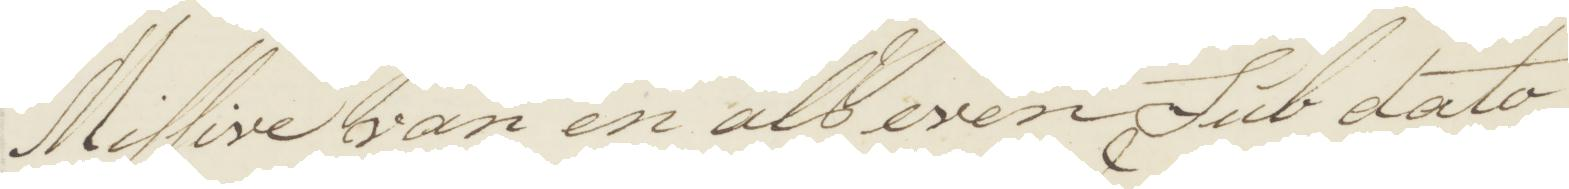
Missive van en als even sub dato
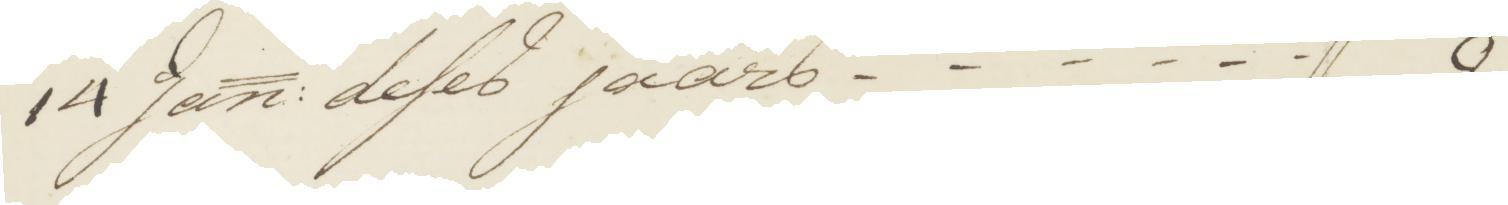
14 Jan: deses jaars – – – – – – „ 9
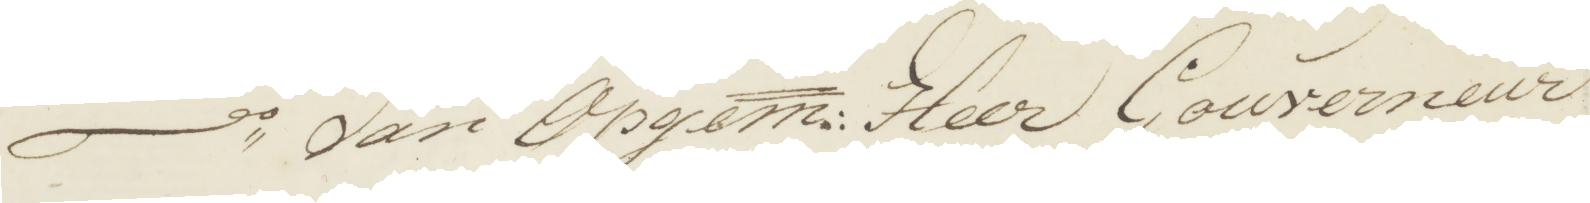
_„o van opgem: Heer Gouverneur
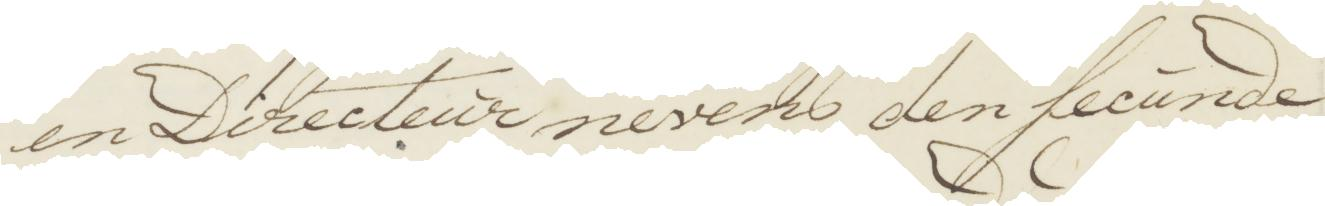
en Directeur nevens den secunde
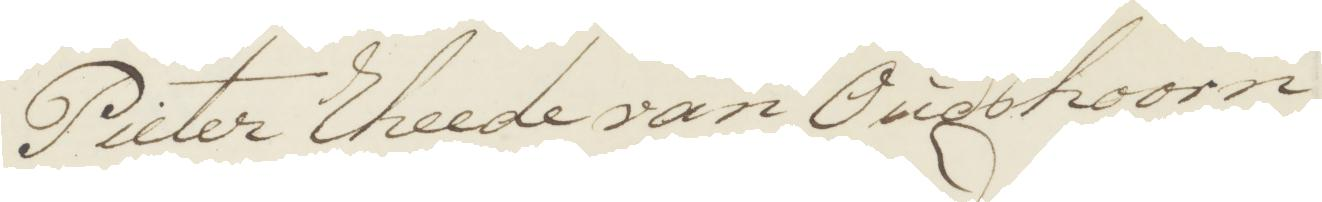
Pieter rheede van Oudshoorn
